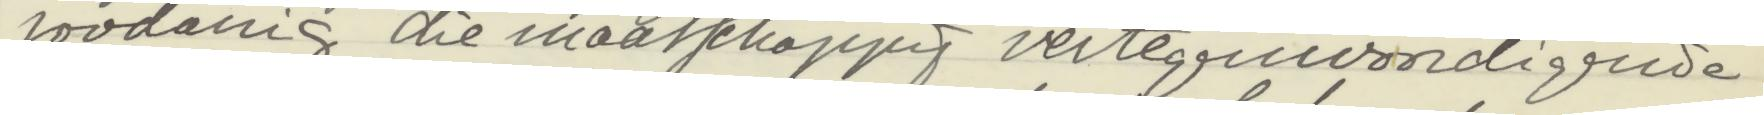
zoodanig die maatschappij vertegenwoordigende
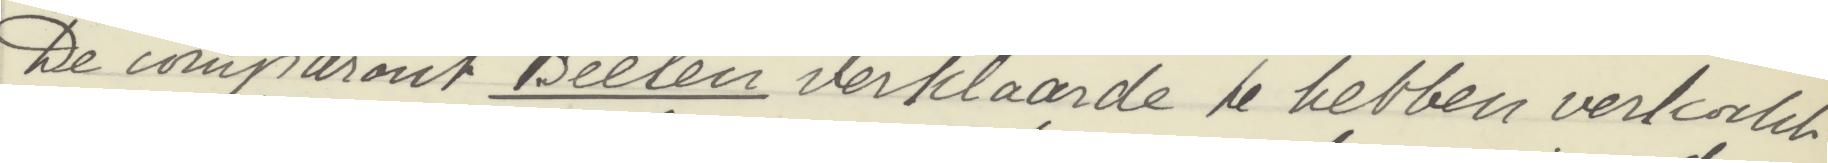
De comparant Beelen verklaarde te hebben verkocht
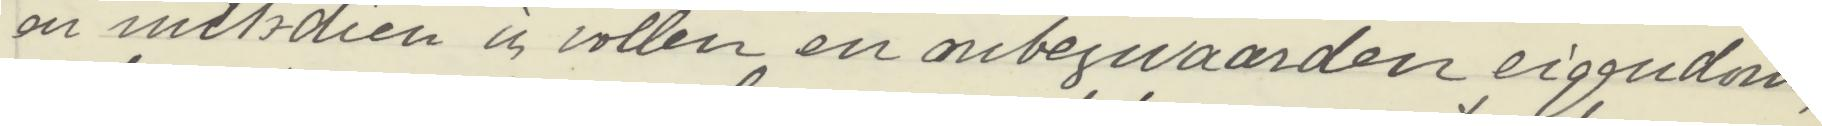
en mitsdien in vollen en onbezwaarden eigendom
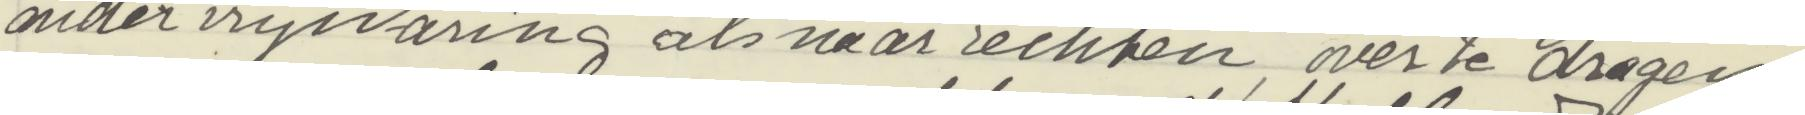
onder vrijwaring als naar rechten over te dregen
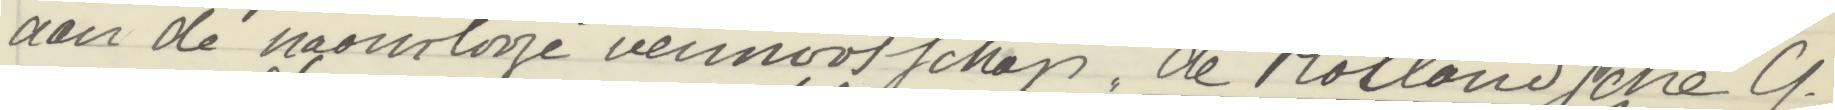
aan de naamlooze vennootschap „ de Hollandsche Y-
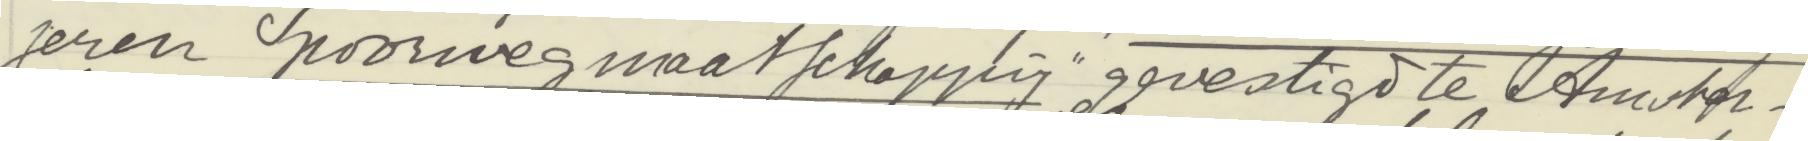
zeren Spoorwegmaatschappij " gevestigd te Amster-
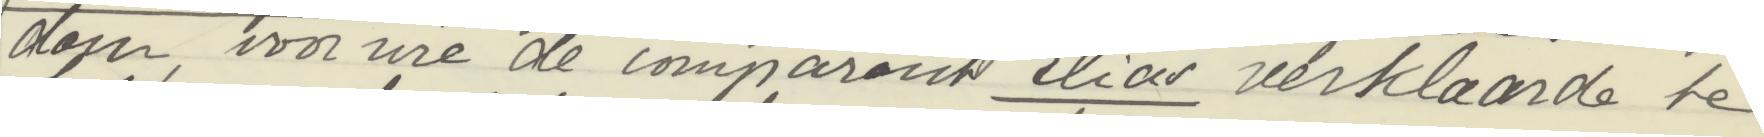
dam voor wie de comparant Elias verklaarde te
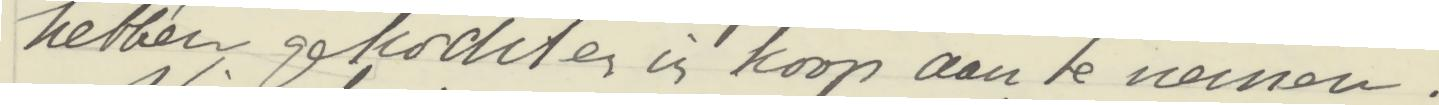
hebben gekocht en in koop aan te nemen
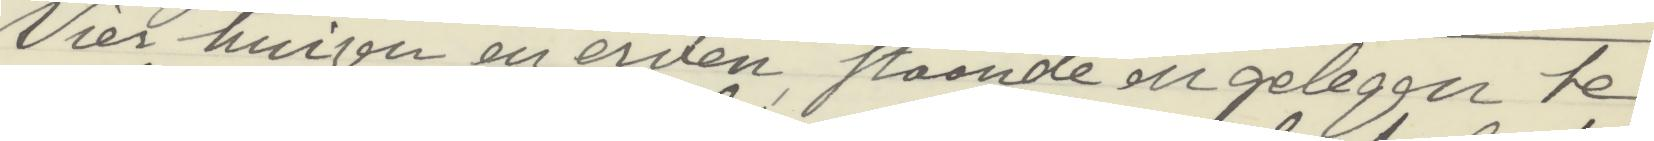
Vier huizen en erven staande en gelegen te
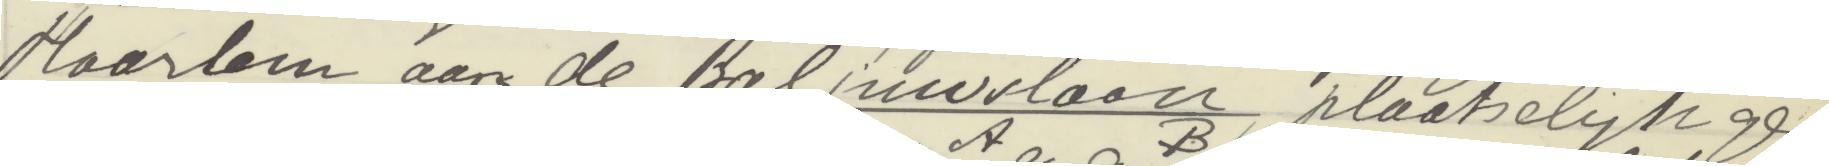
Haarlem aan de Baljuwslaan plaatselijk ge
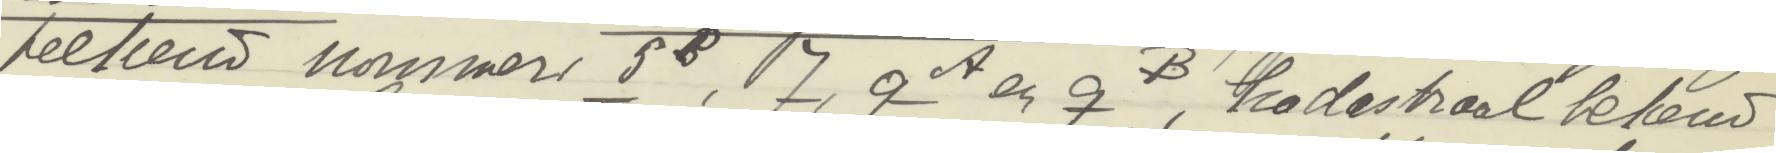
teekend nommer 5B, 7, 9A en 9B, kadastraal bekend
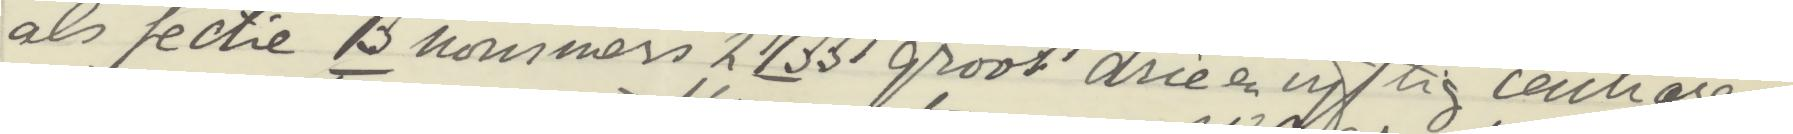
als sectie B nommers 2133 groot drie en vijftig centiaren
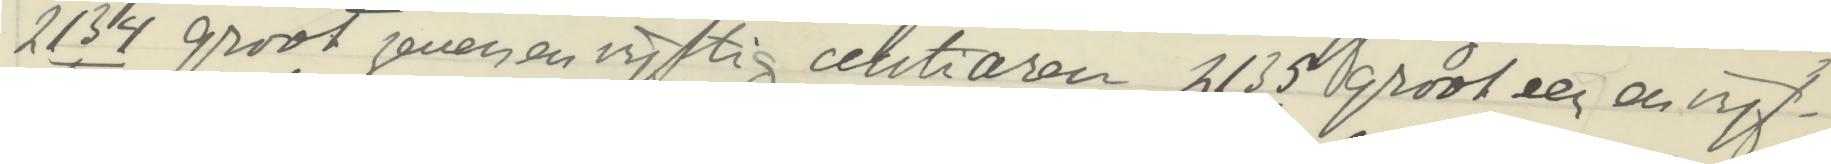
2134 groot zeven en vijftig centiaren, 2135 groot een en vijf-
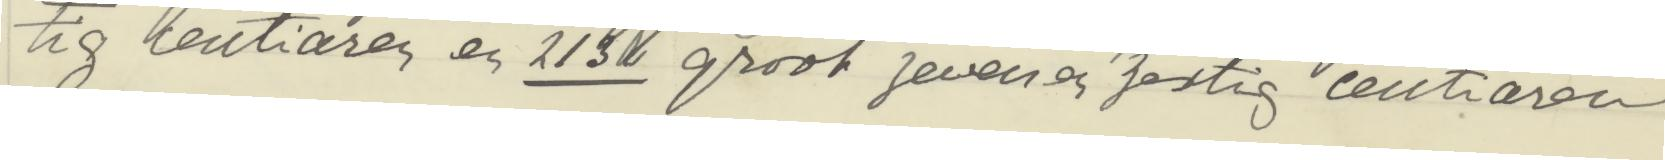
tig centiaren en 2136 groot zeven en zestig centiaren
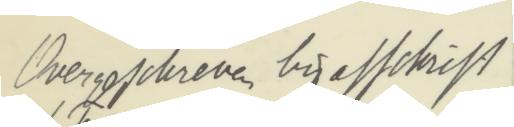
Overgeschreven bij afschrift
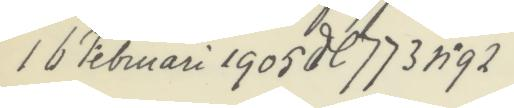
16 Februari 1905 dl 731 no 92
